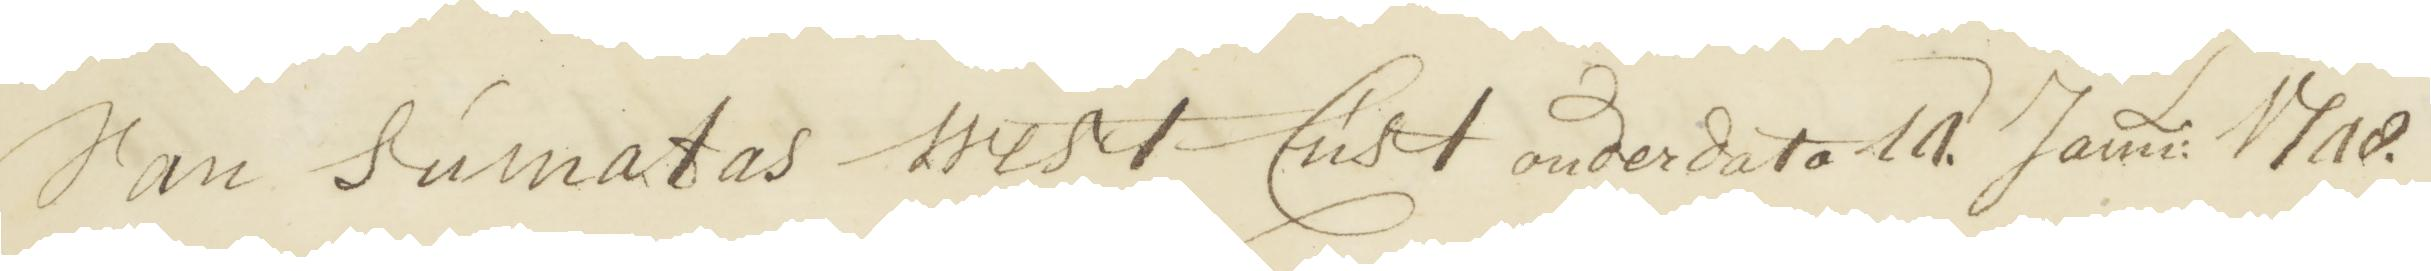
Van Sumatas West Cust onderdato 14.' Jann: 1748.
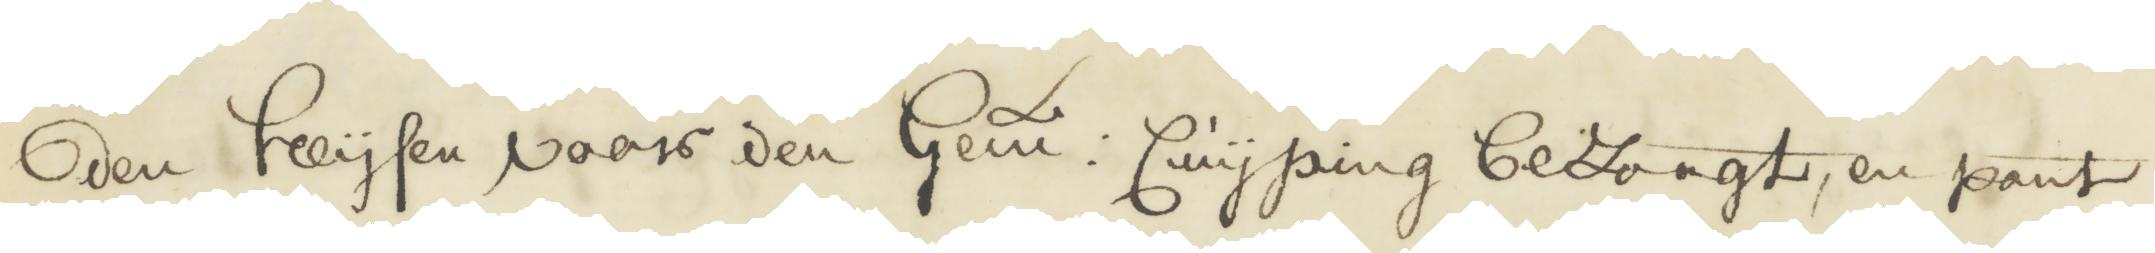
den keijser voor den Gem: Cuijping bezorgt, en pant
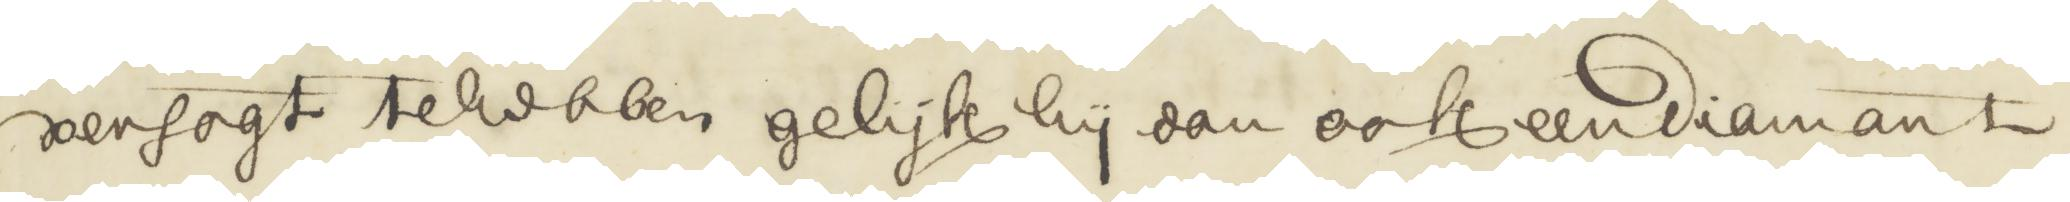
versogt te hebben gelijk hij dan ook een diamant
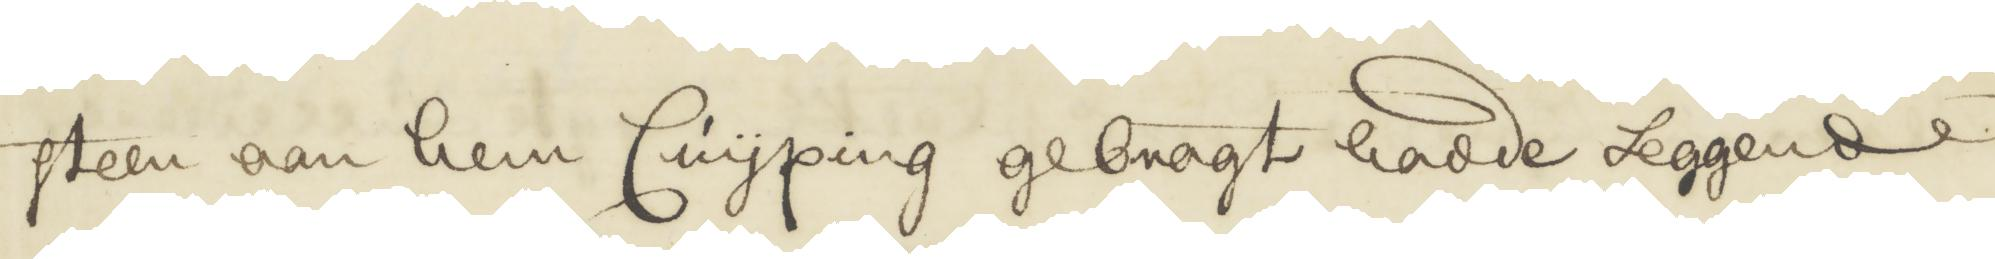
steen aan hem Cuijping gebragt hadde seggende
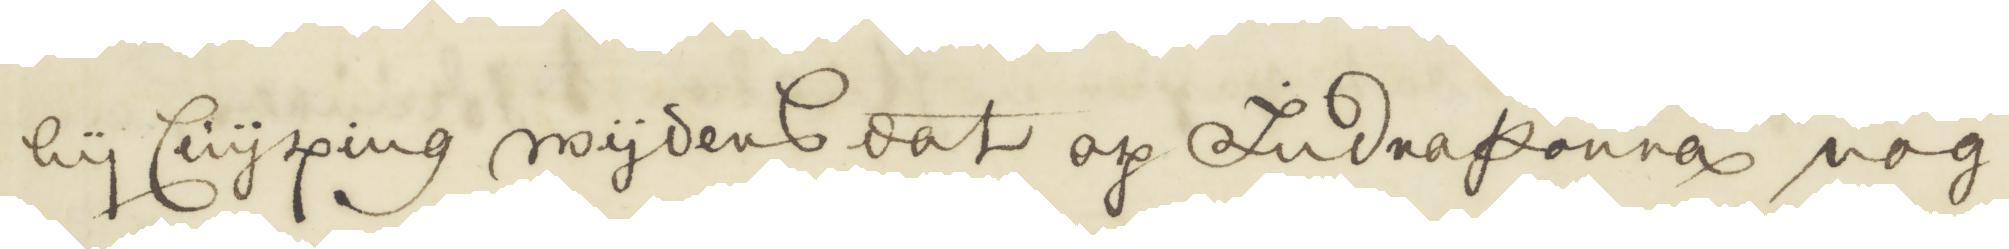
hij Cuijping wijders dat op Jndrapoura nog
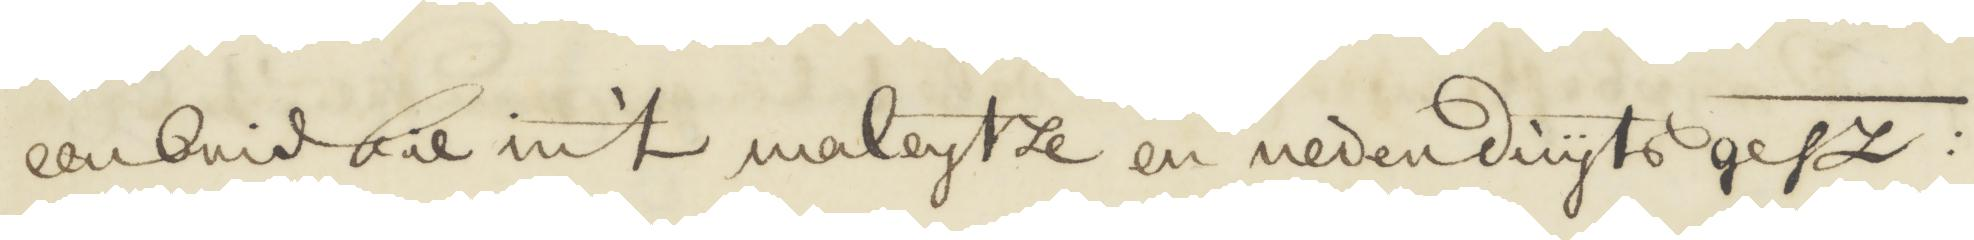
een briefie in’t maleijtze en nederduijts gesz:
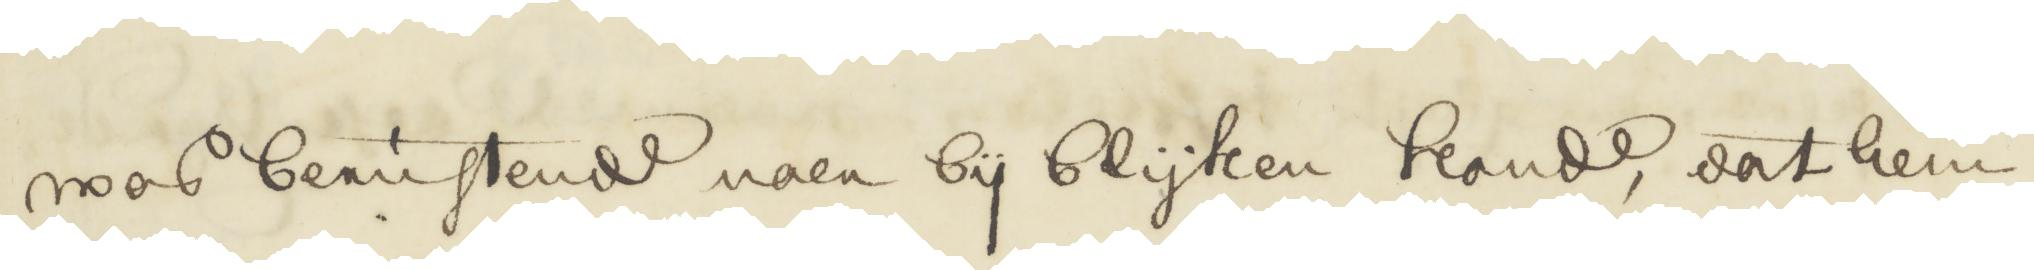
was berustende naer bij blijken konde, dat hem
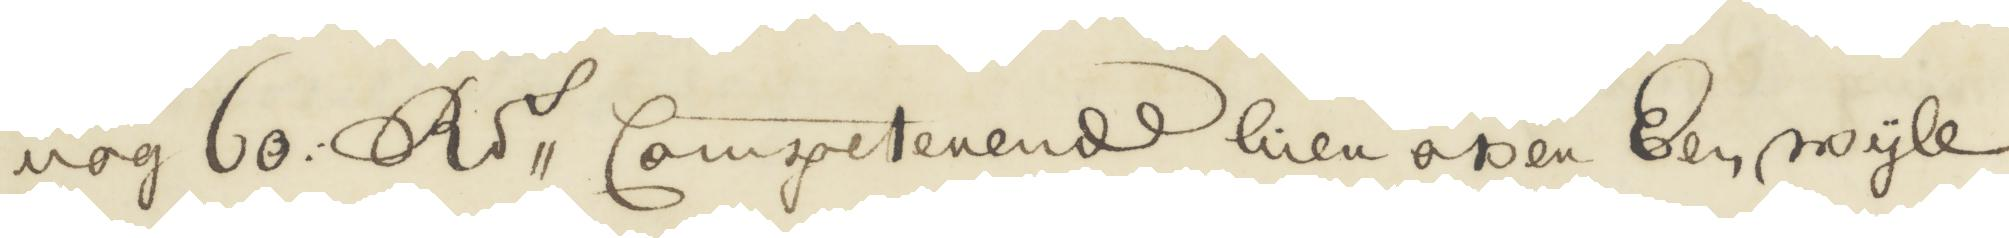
nog 60. Rd„s Competerende hier over Een wijle
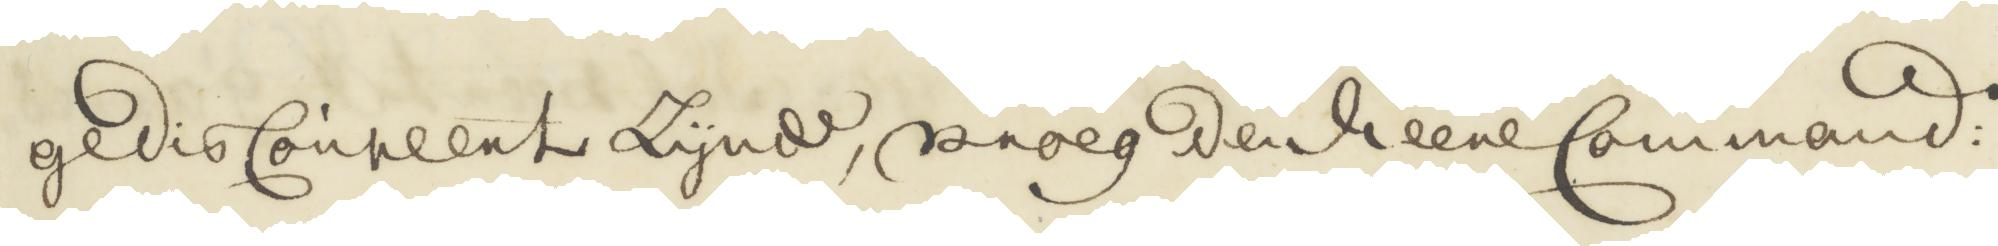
gediscoureert zijnde, vroeg den heere Command:r
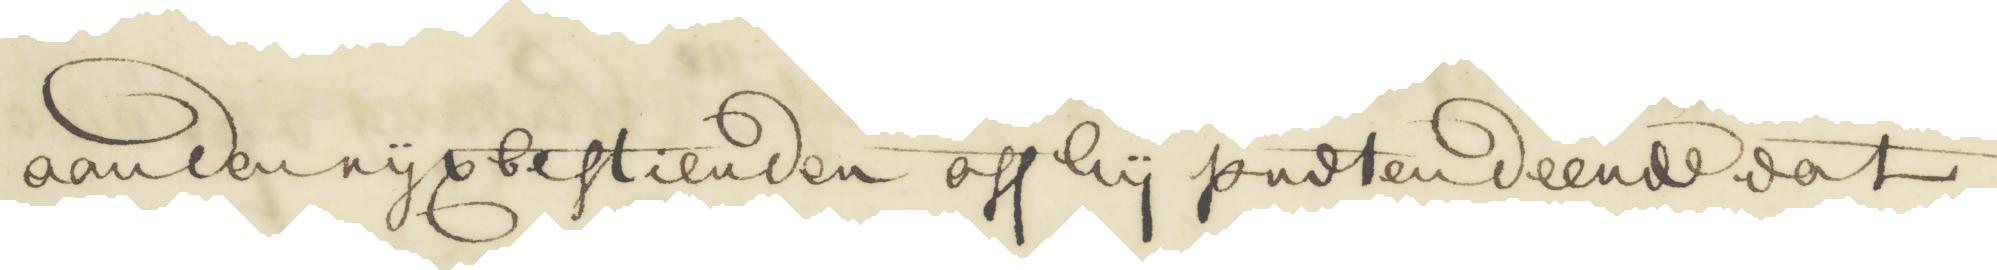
aan een rijxbestierder off hij pretendeerde dat
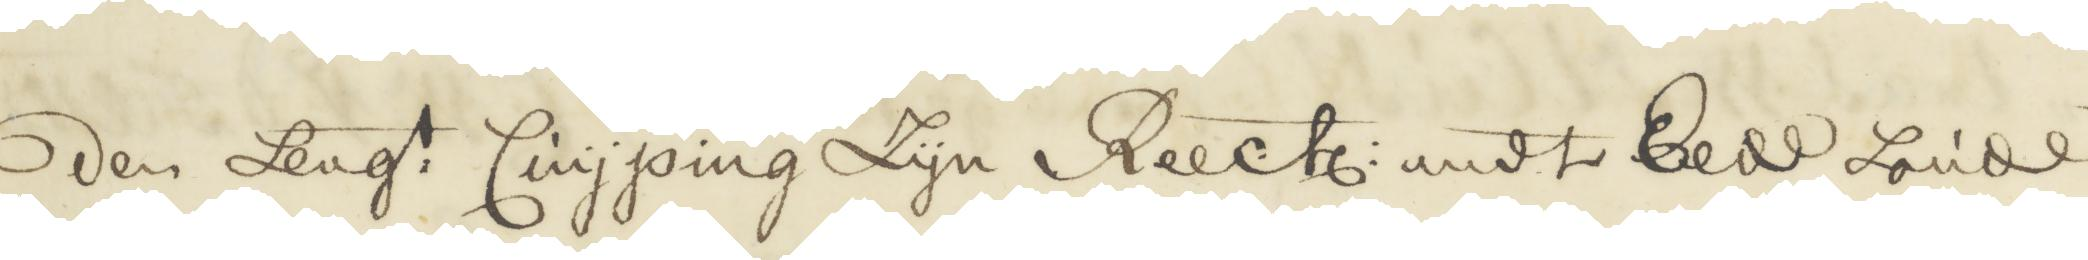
den serg:t Cuijping zijn Reeck: met Eede soude
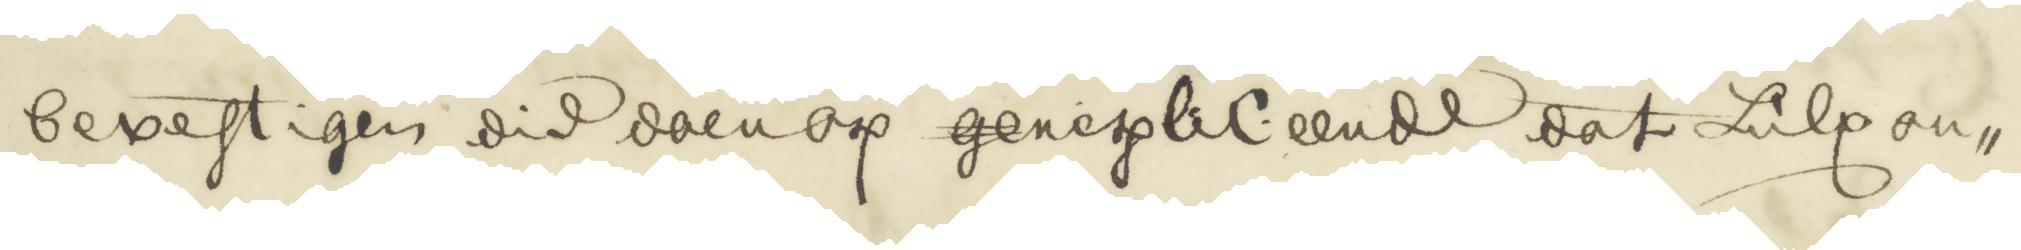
bevestigen die daer op gerepliceerde dat zulx on„
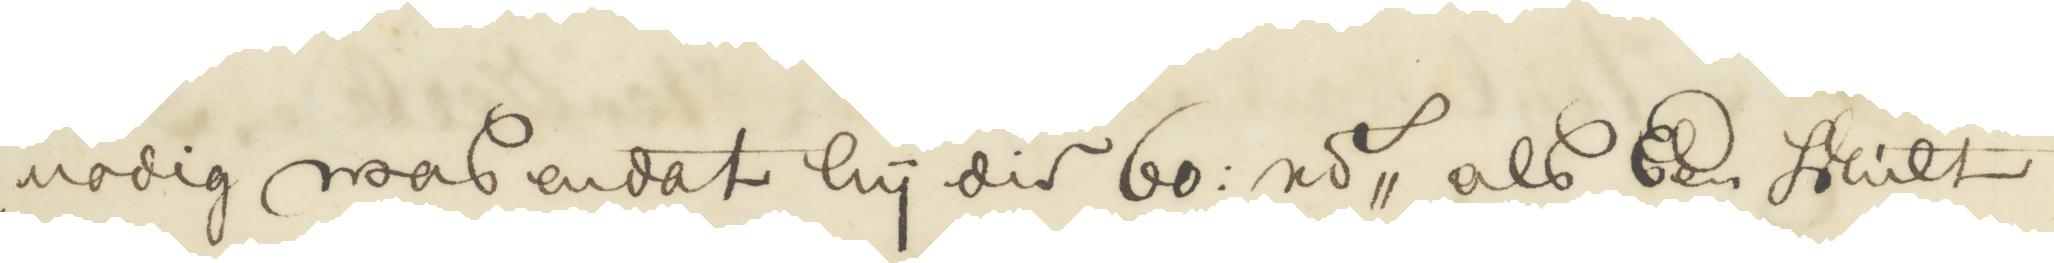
„nodig was en dat hij die 60: rd„s als Een schult
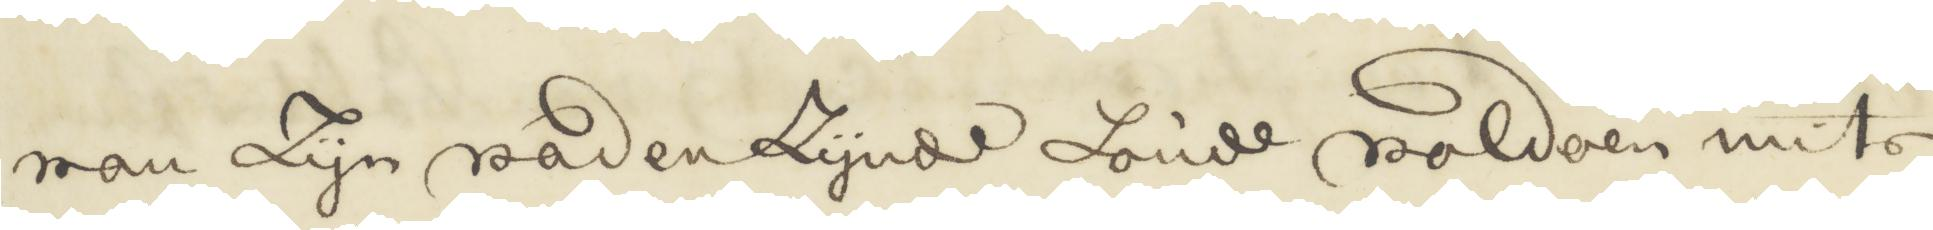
van zijn vader zijnde soude voldoen mits
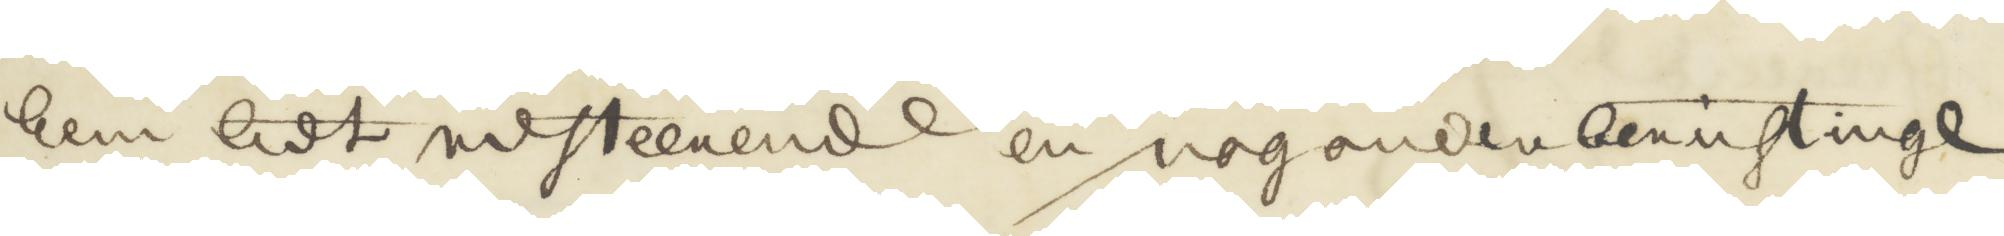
hem het resteerende en nog onderberustinge
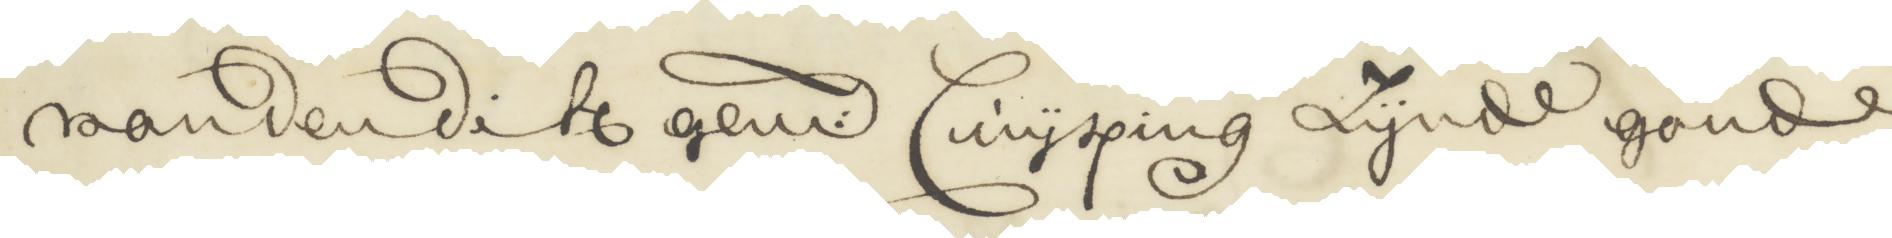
van den dik gem: Cuijping zijnde goude
